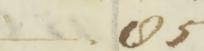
- .85
